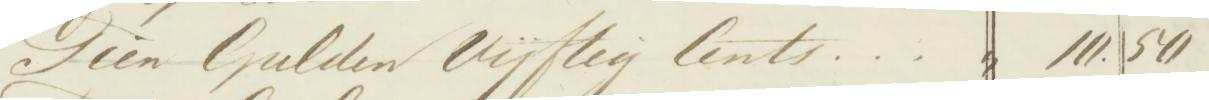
Tien Gulden Vijftig Cents . . . „ 10.50
